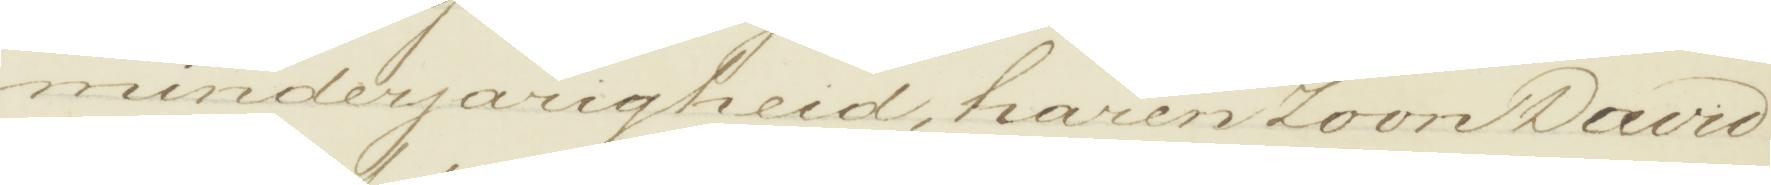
minderjarigheid, haren zoon David
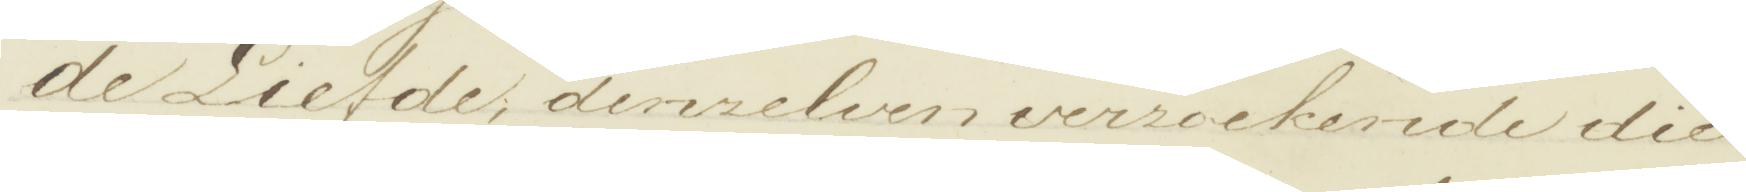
de Liefde; denzelven verzoekende die
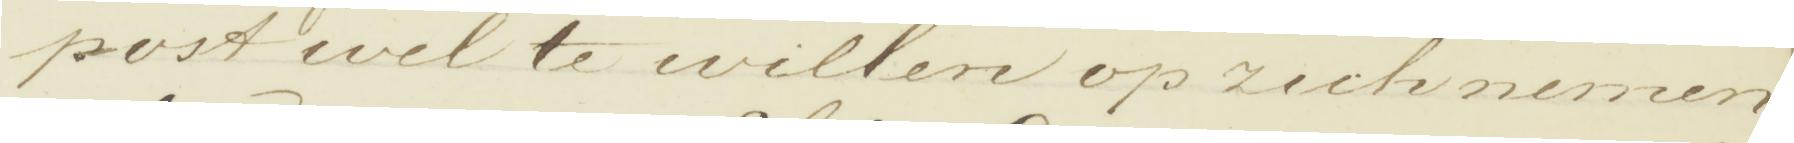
post wel te willen op zich nemen.
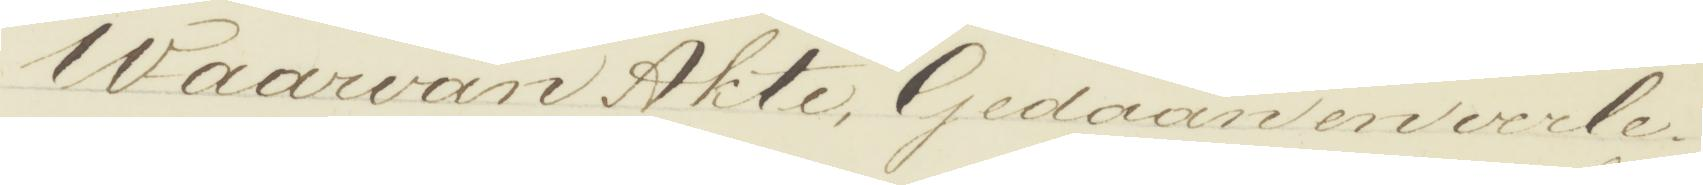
Waarvan Akte, Gedaan en verle„
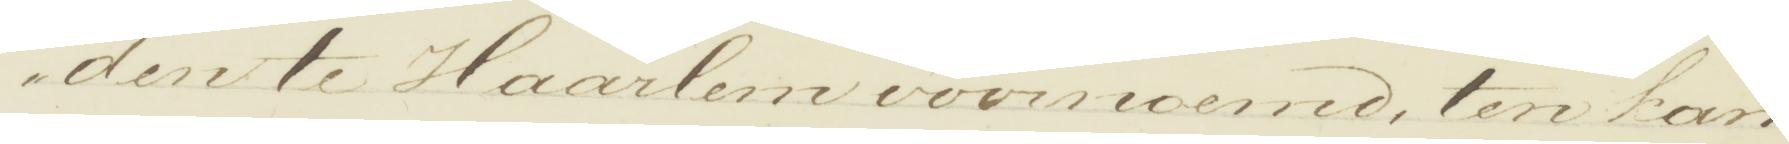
„den te Haarlem voornoemd, ten kan
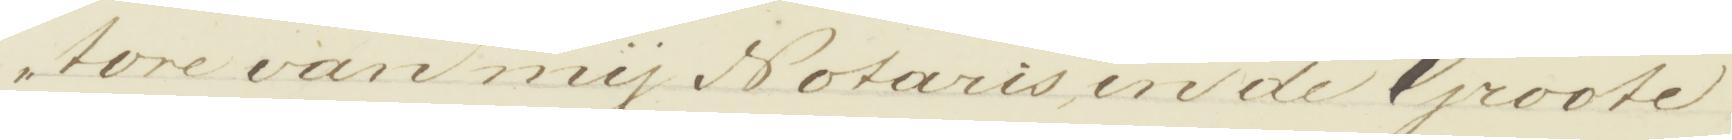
„tore van mij Notaris in de Groote
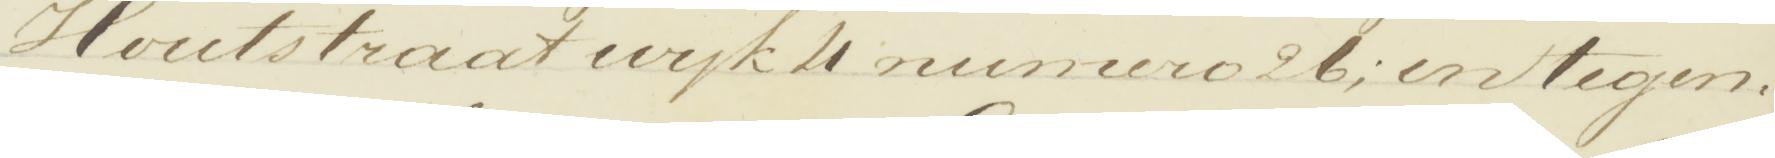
Houtstraat wyk 4 numero 26; in tegen.
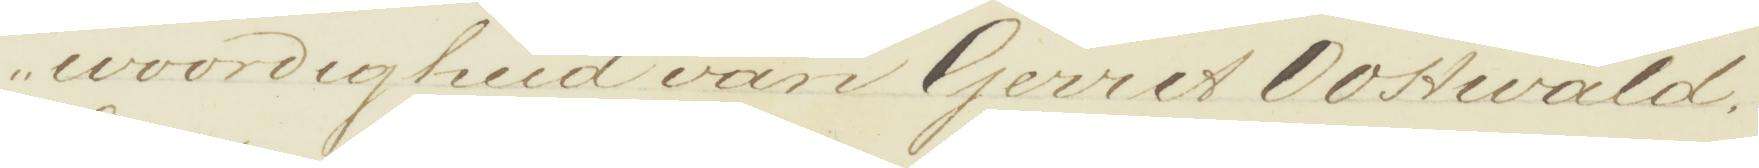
„woordigheid van Gerrit Oostwald,
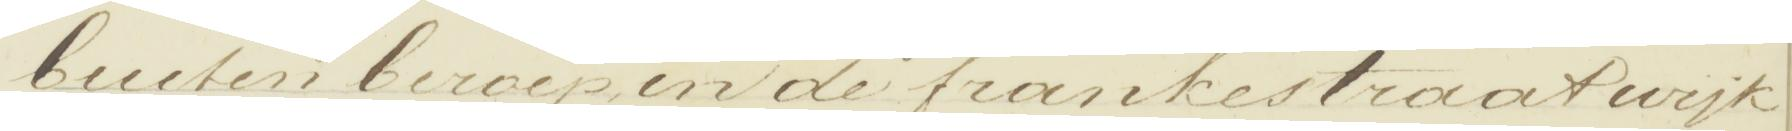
buiten beroep, in de frankestraat wijk
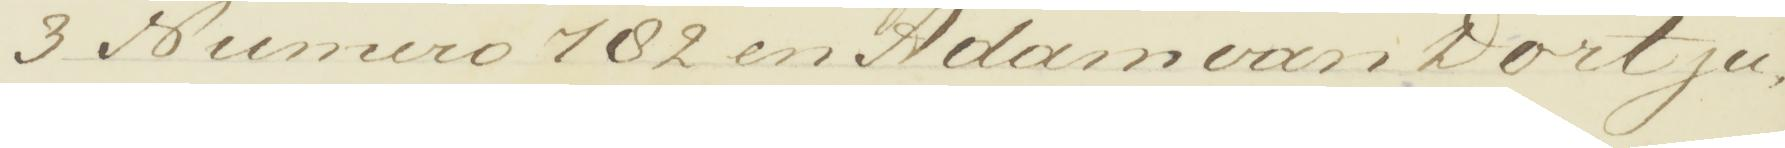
3 Numero 782 en Adam van Dort ju
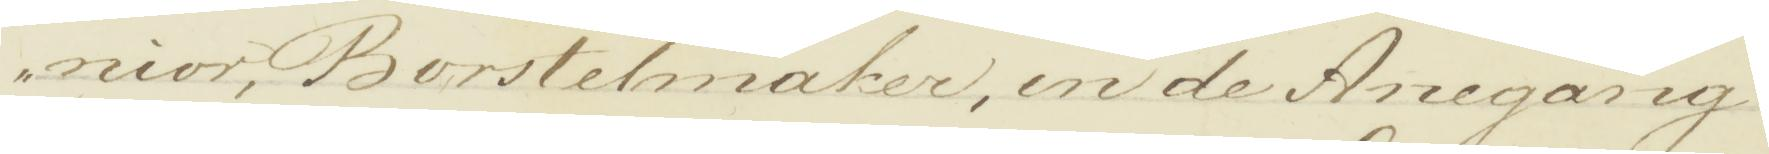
„nior, Borstelmaker, in de Anegang
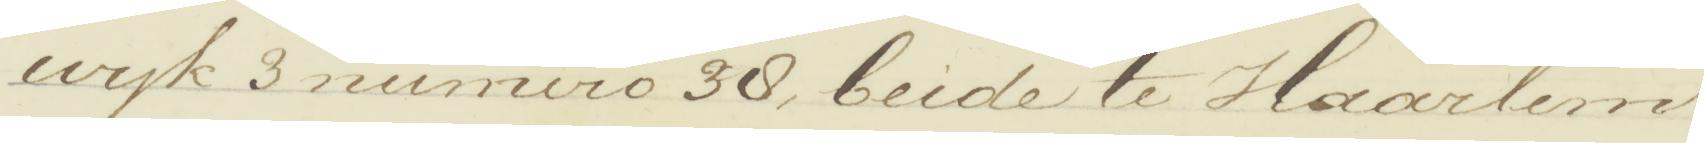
wyk 3 numero 38, beide te Haarlem
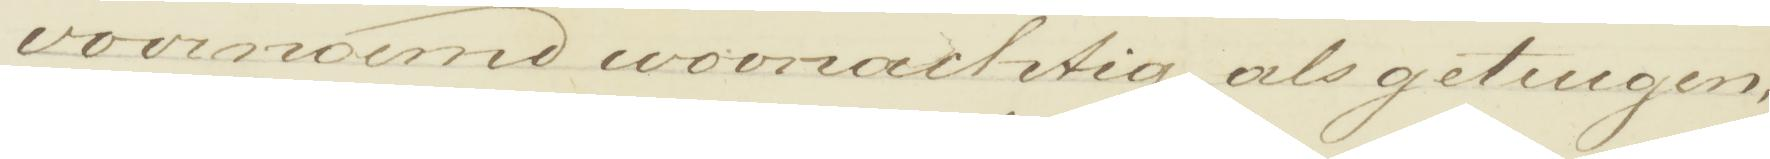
voornoemd woonachtig, als getuigen
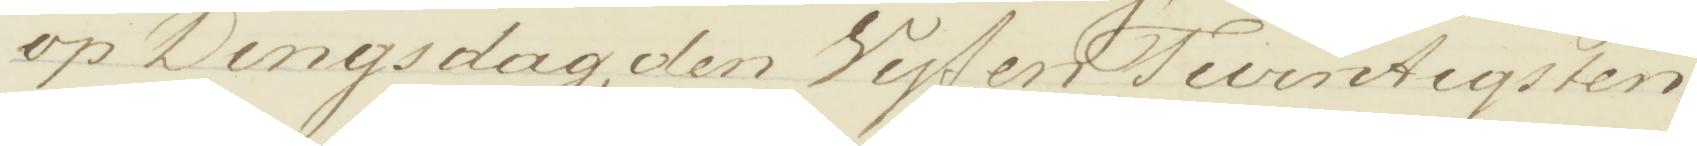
op Dingsdag, den Vyf en Twintigsten
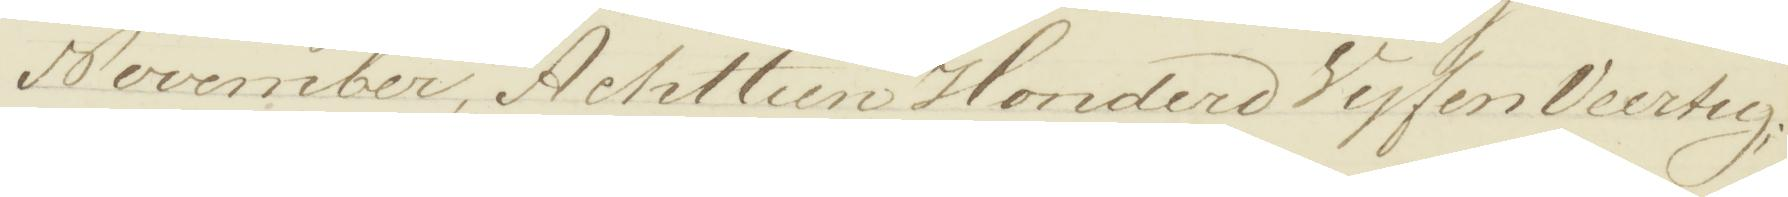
November, Achttien Honderd Vyf en Veertig,
